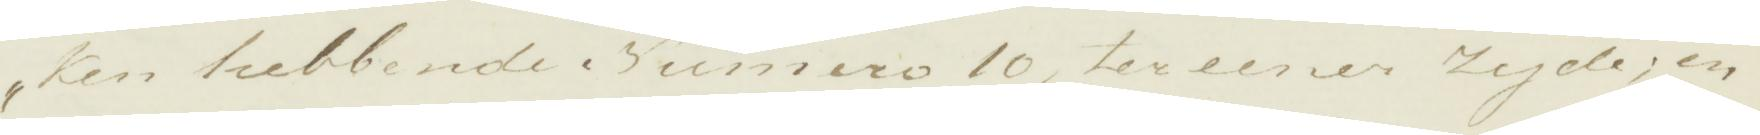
„ken hebbende Numero 10, ter eener zyde; en
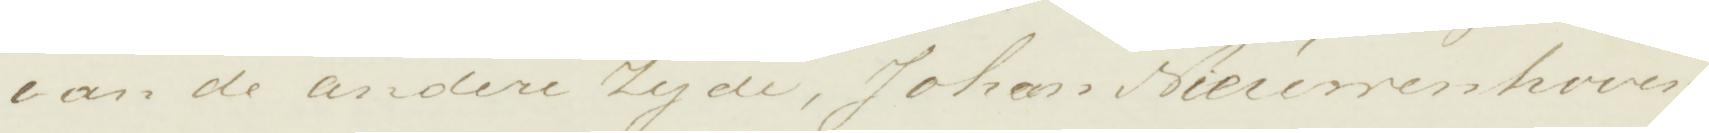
van de andere zyde, Johan Nieuwenhoven
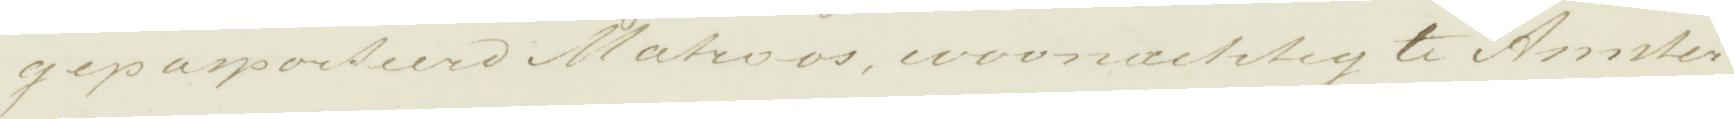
gepasporteerd Matroos, woonachtig te Amster
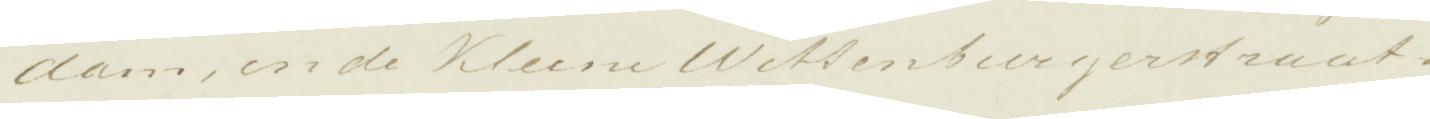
dam, in de Kleine Wittenburgerstraat
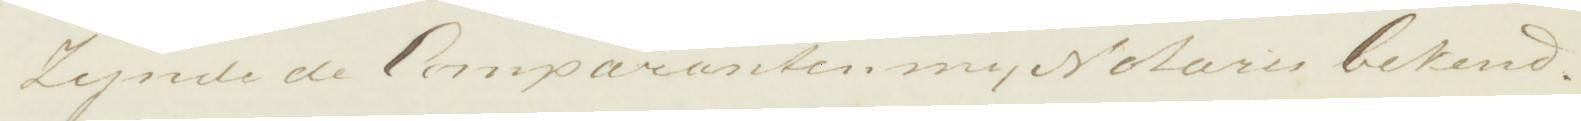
Zynde de Comparanten my Notaris bekend.
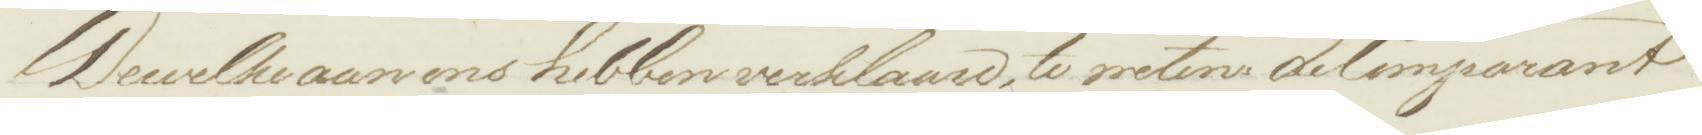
Dewelke aan ons hebben verklaard, te weten de Comparant
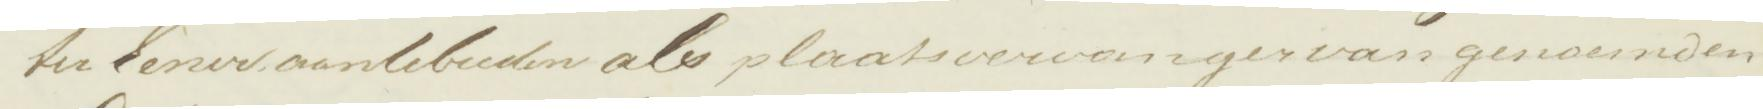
ter Eener, aantebieden als plaatsvervanger van genoemden
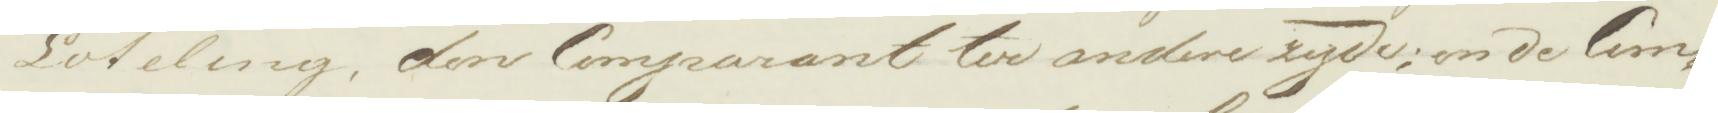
Loteling, den Comparant ter andere zijde; en de Com„
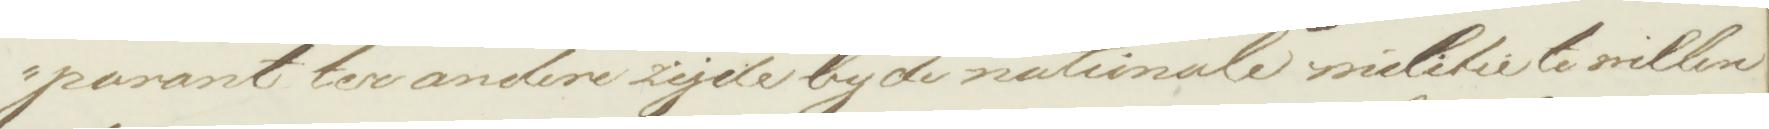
„parant ter andere zijde by de nationale militie te willen
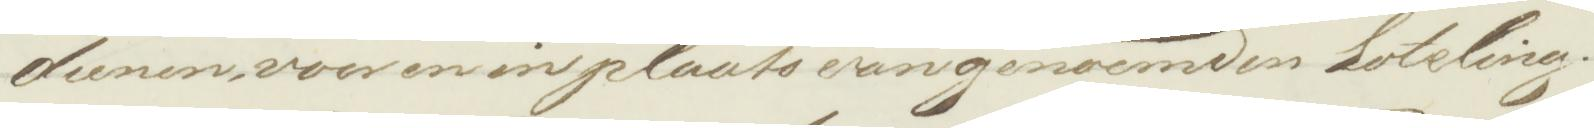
dienen, voor en in plaats van genoemden Loteling
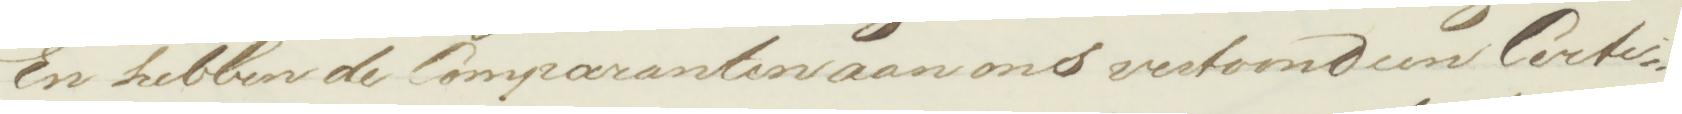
En hebben de Comparanten aan ons vertoond een Certi„
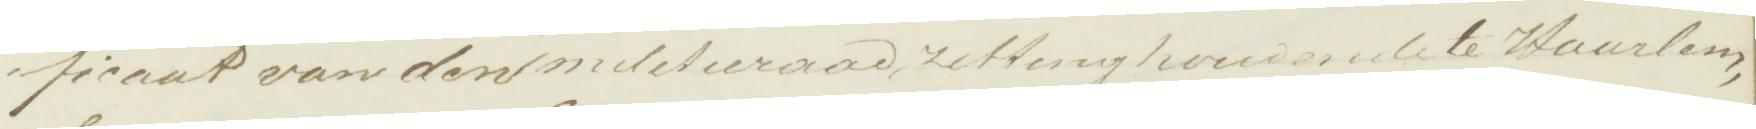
„ficaat van den militieraad, zitting houdende te Haarlem,
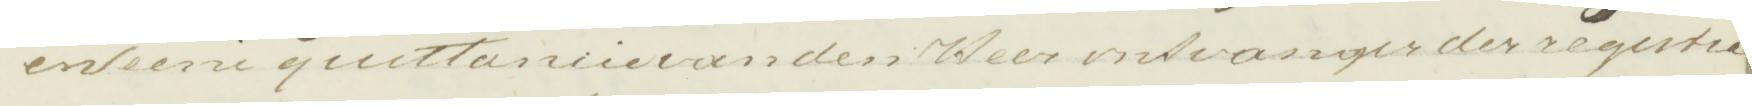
en eene quittancie van den Heer ontvanger der registra
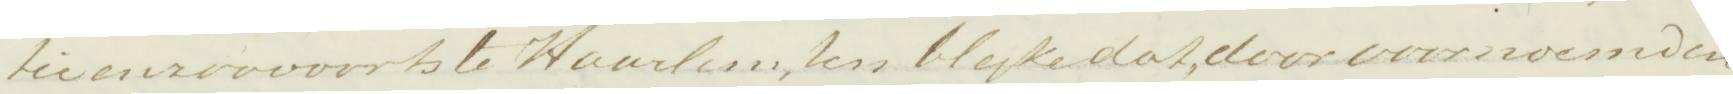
tie enzoovoorts te Haarlem, ten blyke dat, door voornoemden
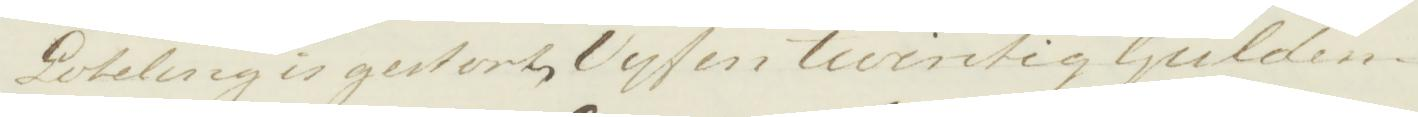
Loteling is gestort Vyf en twintig Gulden.
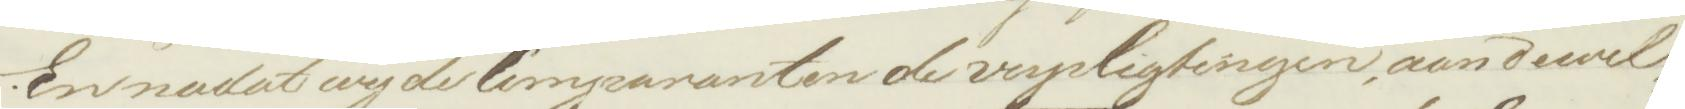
En nadat wy de Comparanten de verpligtingen, aan dewel„
